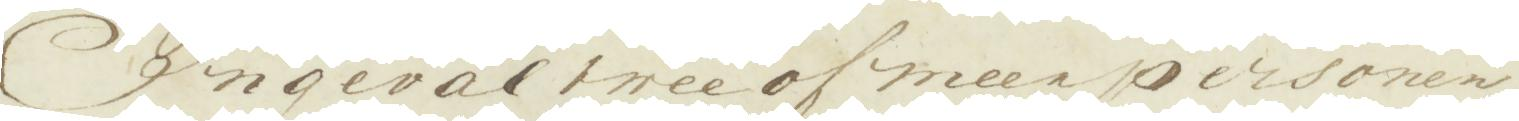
Ingeval twee of meer personen
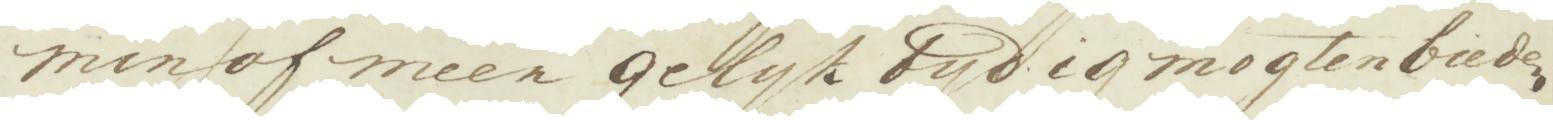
min of meer gelyk tydig mogten bieden
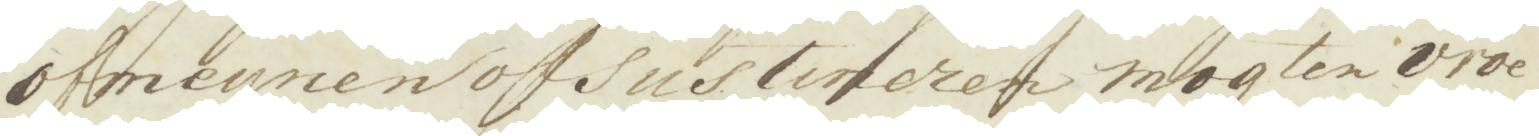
of meijnen of sustineren mogten vroe
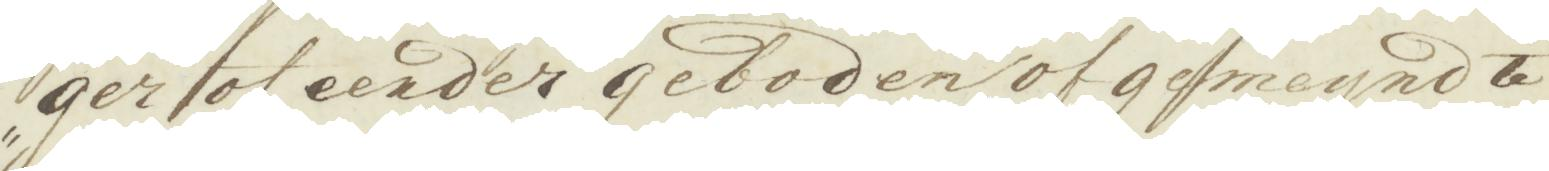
„ger of eerder geboden of gemeijnd te
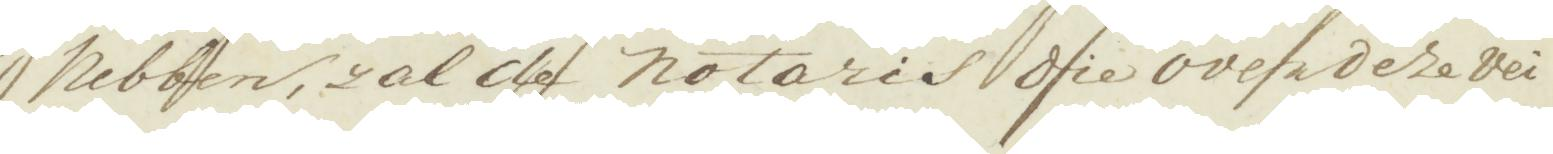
hebben, zal de Notaris die over deze vei
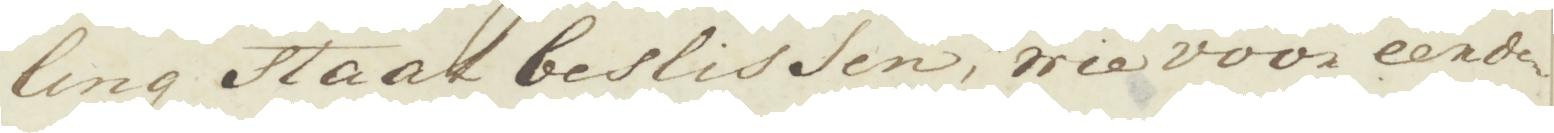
ling staat beslissen, wie voor eerder
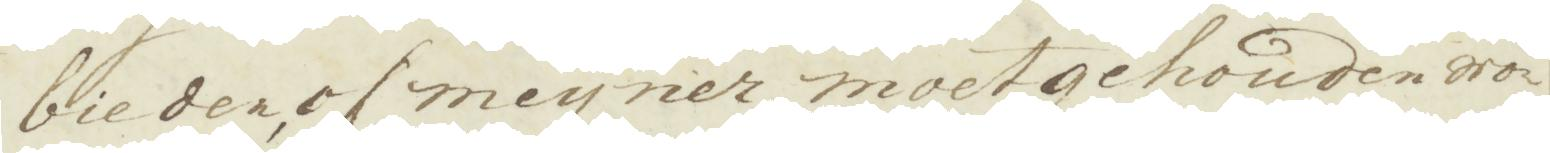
bieder, of meyner moet gehouden wor
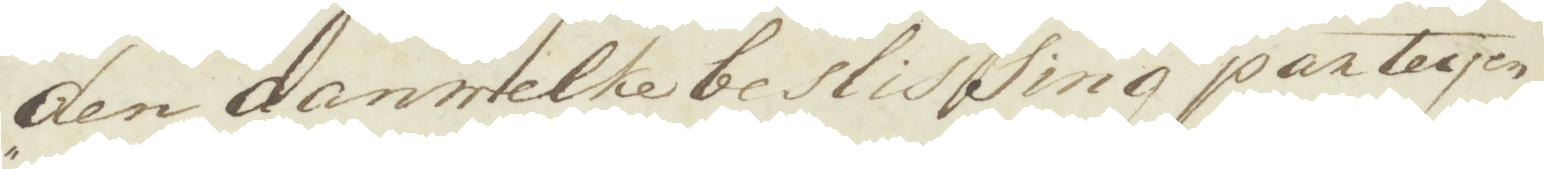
„den, aanwelke beslissing parteijen
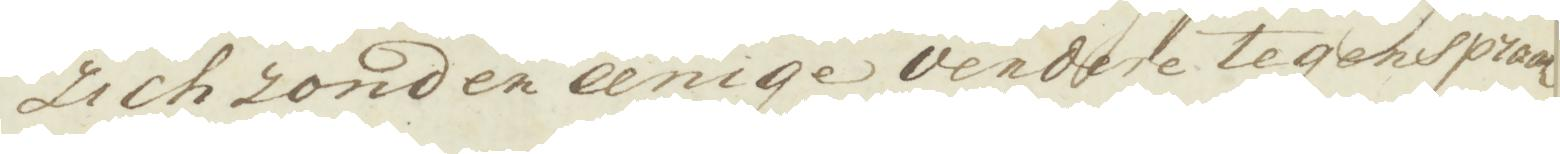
zich zonder eenige verdere tegenspraak
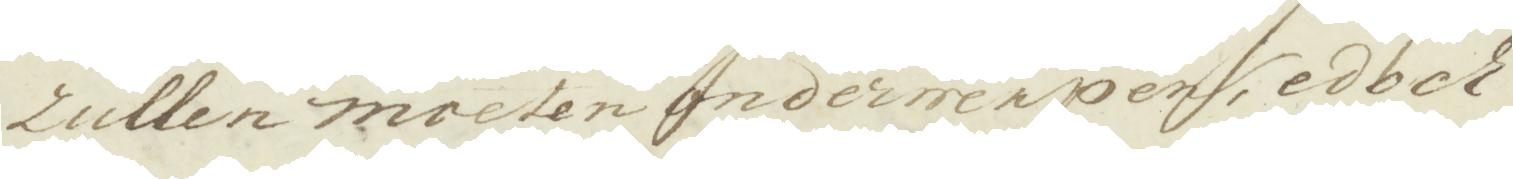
zullen moeten onderwerpen, edoch
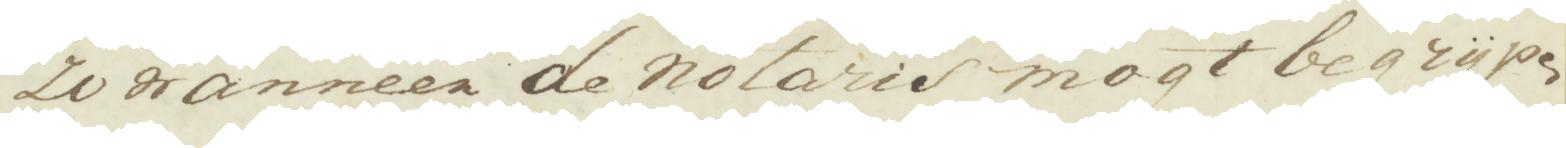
zo wanneer de notaris mogt begrijpen
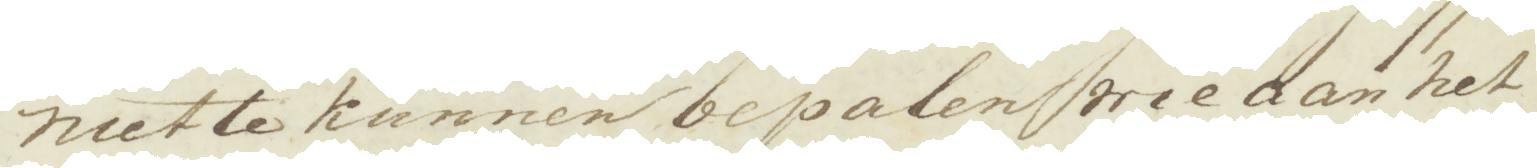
niet te kunnen bepalen wie aan het
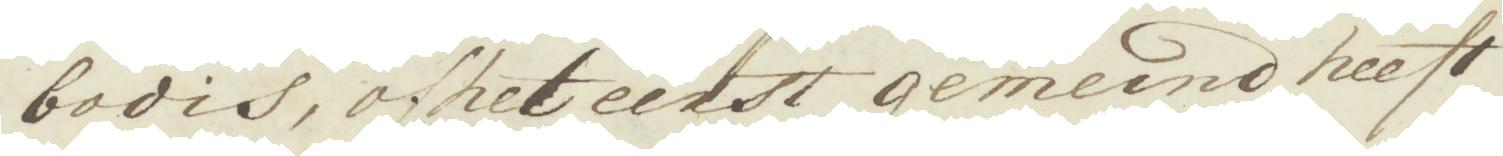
bodis, of het eerst gemeind heeft
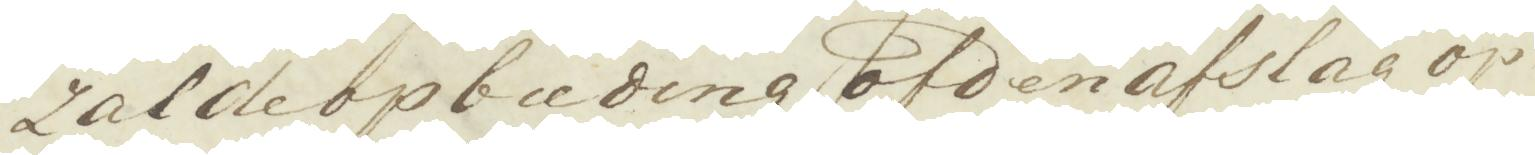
zal de opbieding of den afslag op
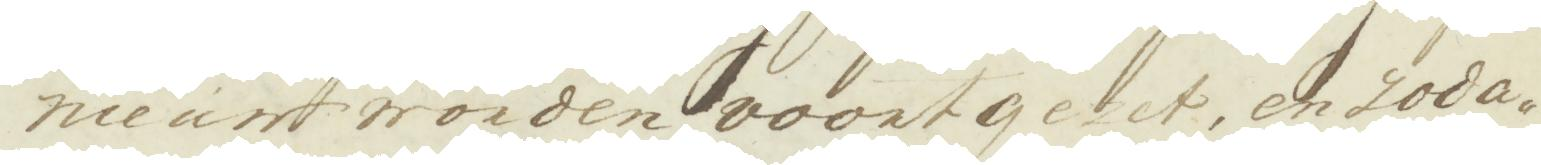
nieuw worden voortgezet, en zoda„
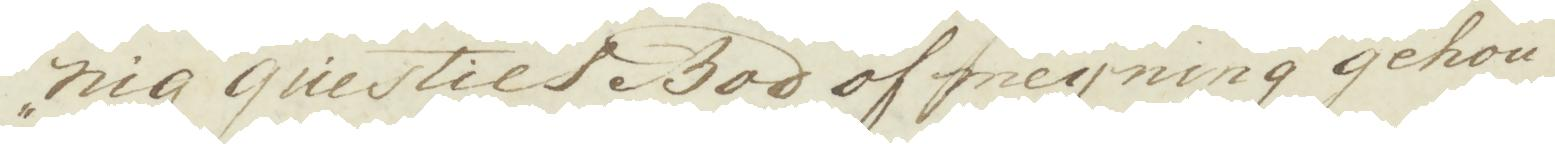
„nig questies Bod of meyning gehou
